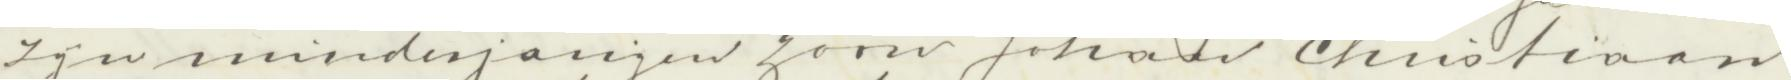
zijn minderjarigen zoon Johan Christiaan
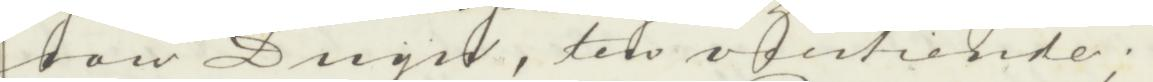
van Duijn, ten veertiende;
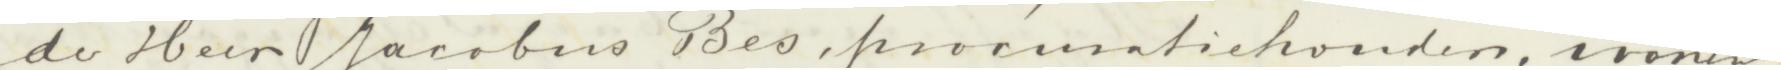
de Heer Jacobus Bes, procuratiehouder, wonen
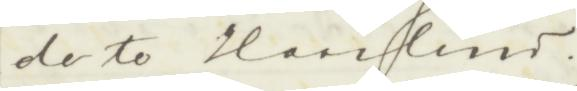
de te Haarlem.
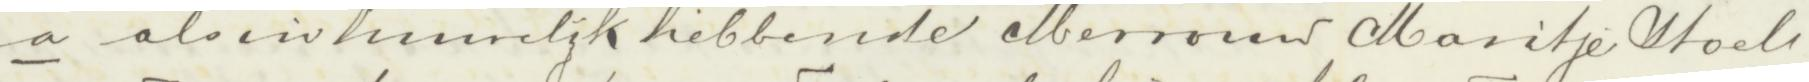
a als in huwelijk hebbende Mevrouw Maritje Stoel
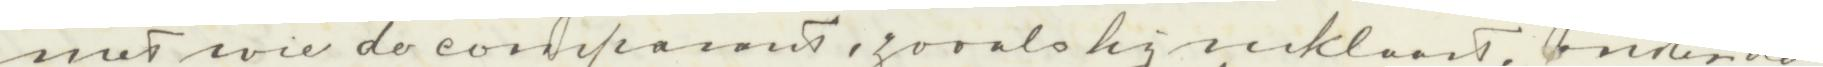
met wie de comparant, zooals hij verklaart onder de
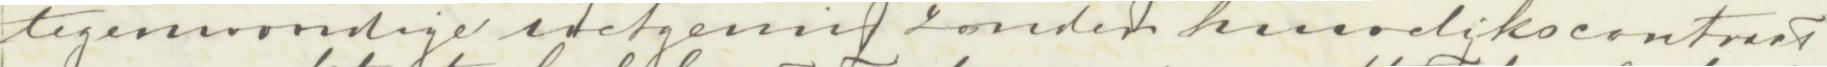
tegenwoordige wetgeving zonder huwelijkscontract
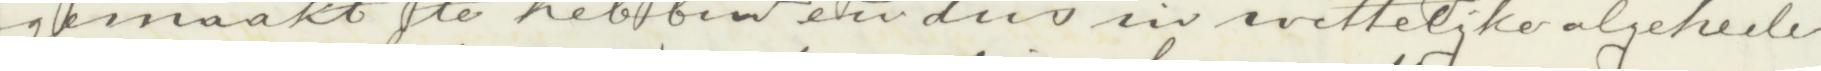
gemaakt te hebben en dus in wettelijke algeheele
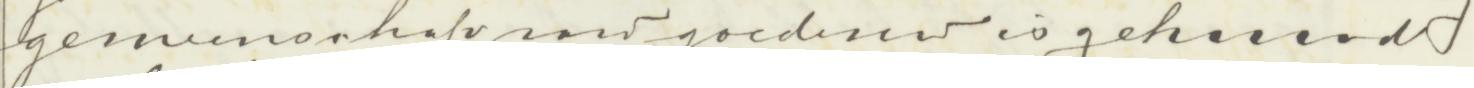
gemeenschap van goederen is gehuwd
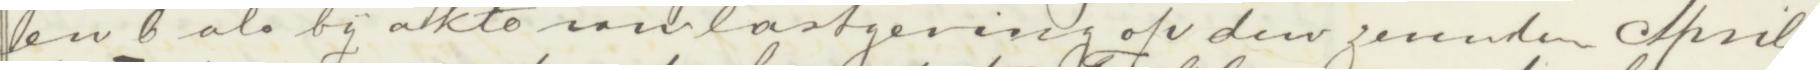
en b als bij akte van lastgeving op den zevenden April
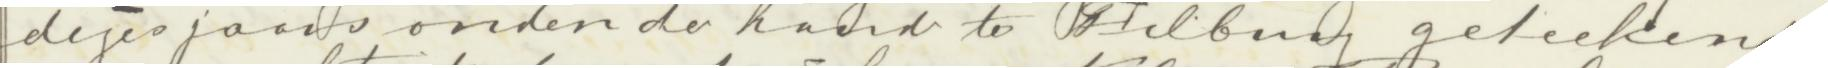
dezes jaars onder de hand te Tilburg geteekend
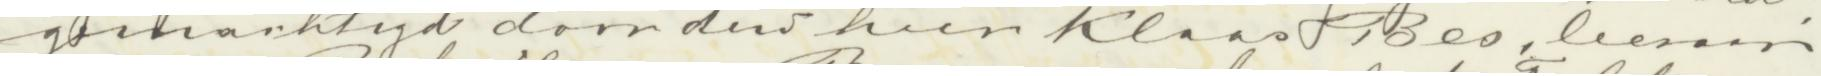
gemachtigd door den heer Klaas Bes, leeraar
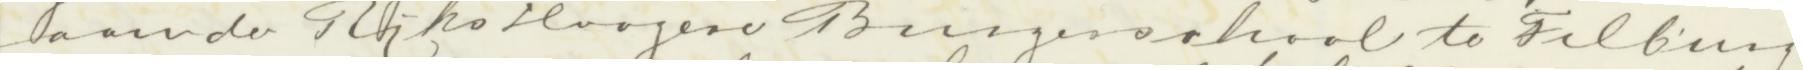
aan de Rijks Hoogere Burgerschool te Tilburg
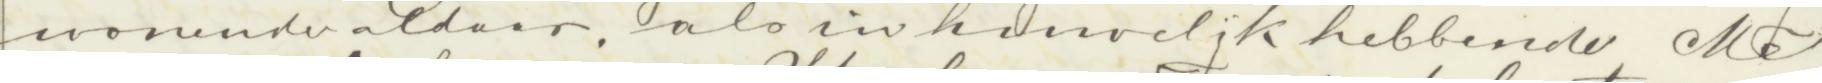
wonende aldaar, als in huwelijk hebbende Me
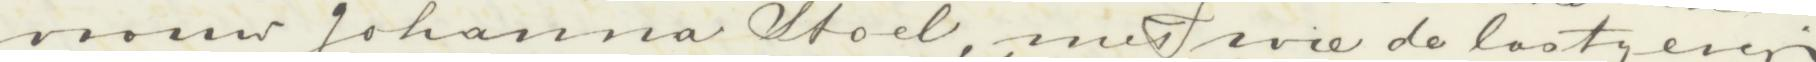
vrouw Johanna Stoel, met wie de lastgever
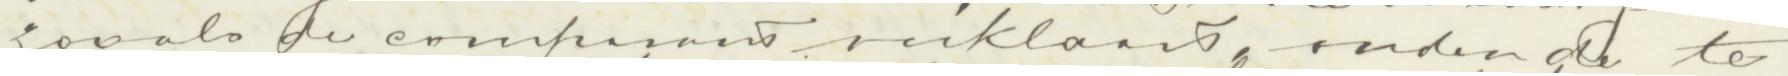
zooals de comparant verklaart, onder de te
